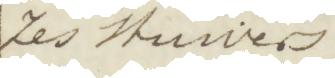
Zes stuivers
